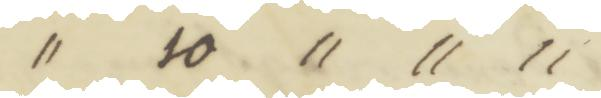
„ 10 „ „ „
